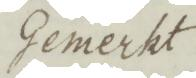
Gemerkt
